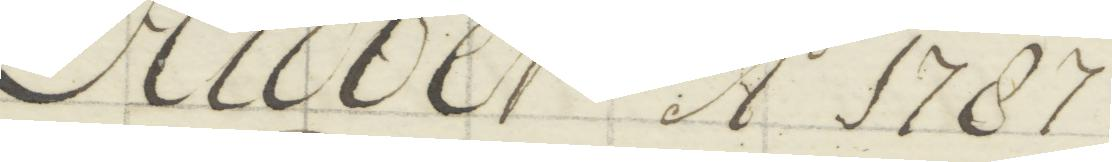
October Ao 1787
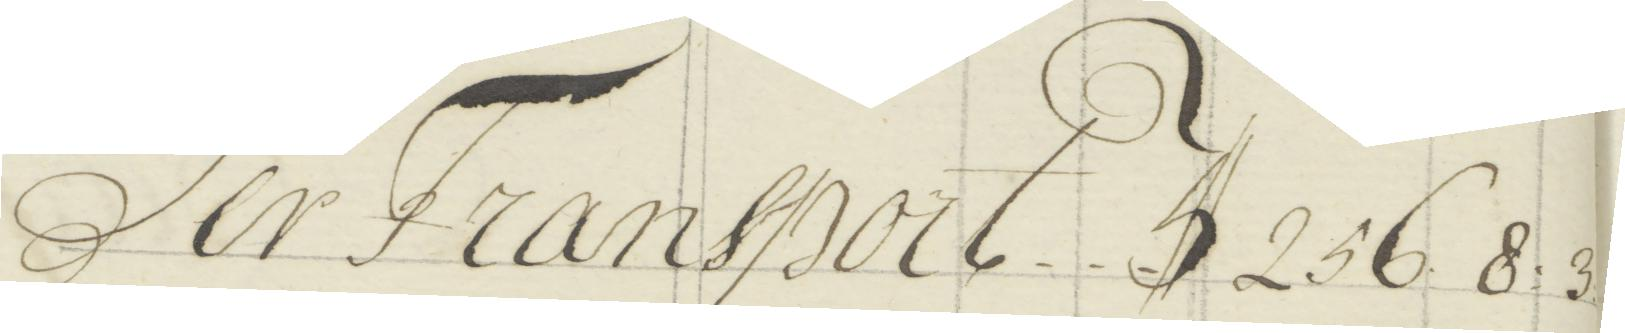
Per Transport - - - H 256: 8: 3
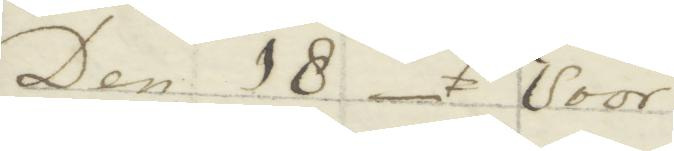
Den 18 _o Voor
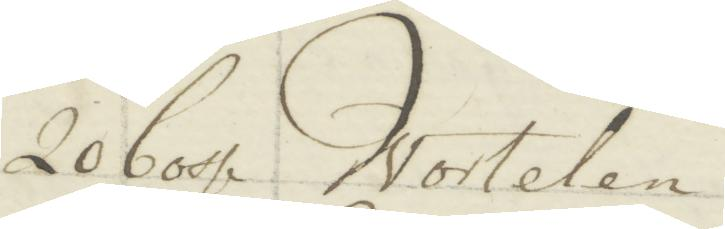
20 bosse Wortelen
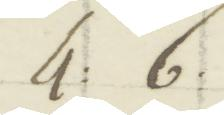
4: 6:
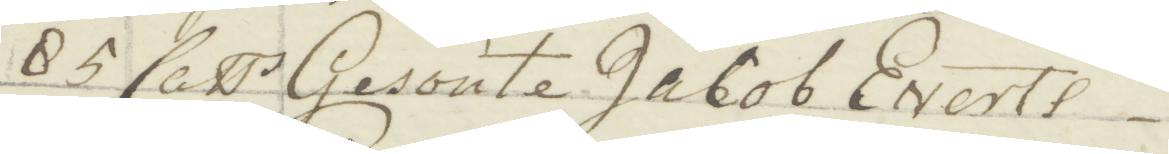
85 Catts Gesoute Jacob Everts -
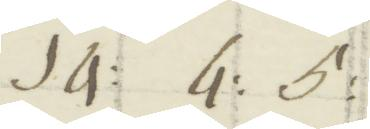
14: 4: 5
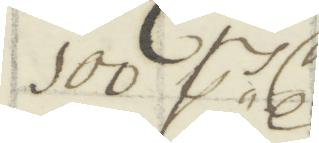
100 P„s
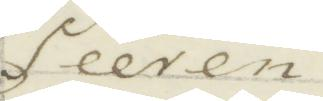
Peeren
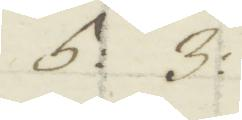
5: 3:
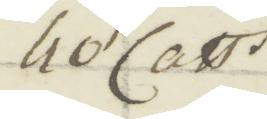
40 Catts
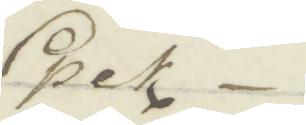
Spek
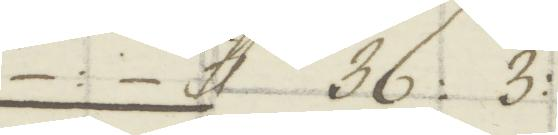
—:— H 36: 3: 5:
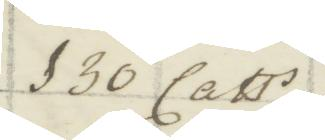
130 Catts
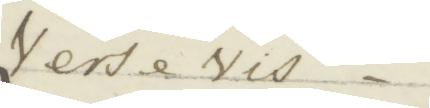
Verse vis _
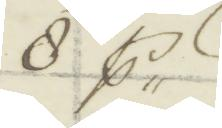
8 p„s
